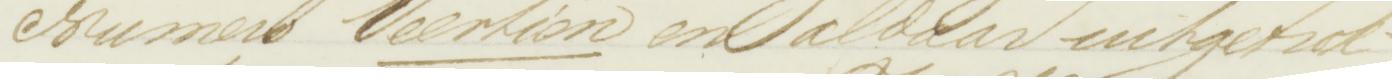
Numero Veertien en aldaar uitgetrok
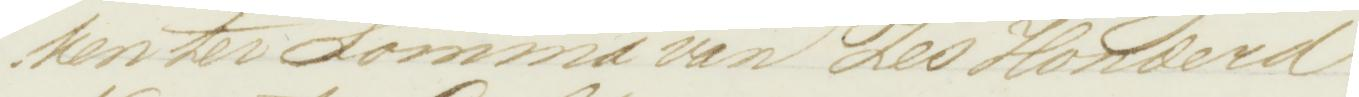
„ken ter somma van Zes Honderd
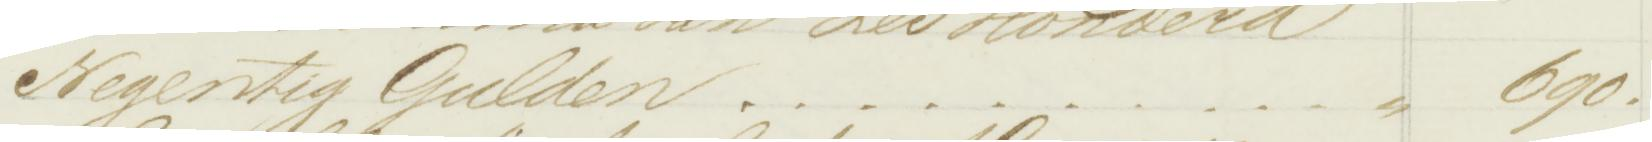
Negentig Gulden . . . . . . . . . . „ 690.
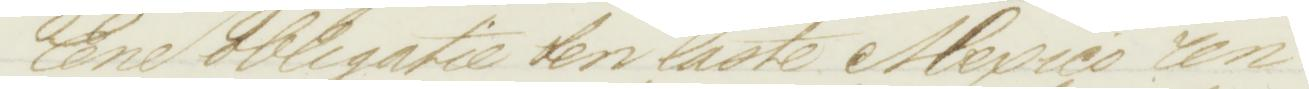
Eene obligatie ten laste Mexico ren
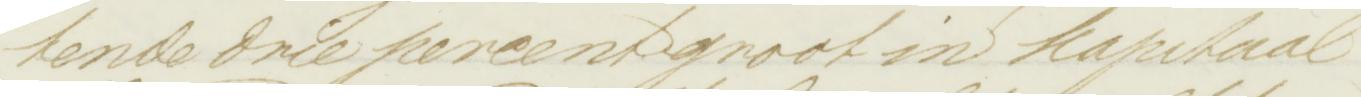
tende drie percent groot in kapitaal
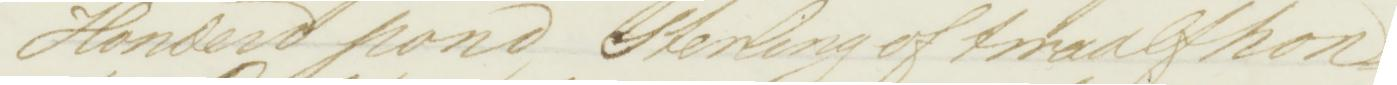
Honderd pond sterling of twaalf hon
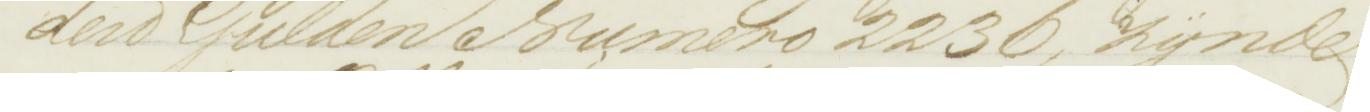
derd Gulden Numero 2236, zijnde
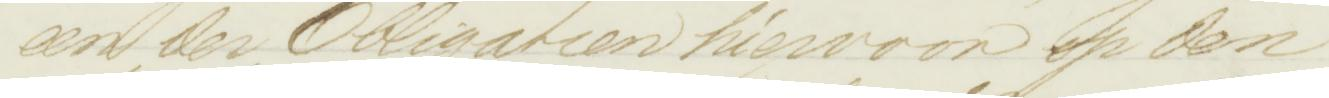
een der Obligatien hiervoor op den
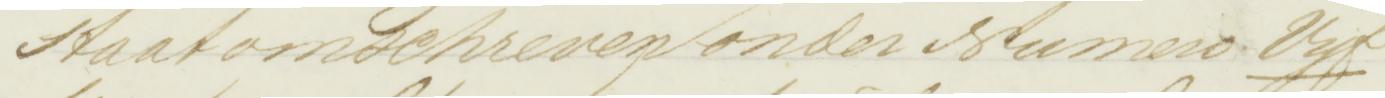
staat omschreven onder Numero Vijf
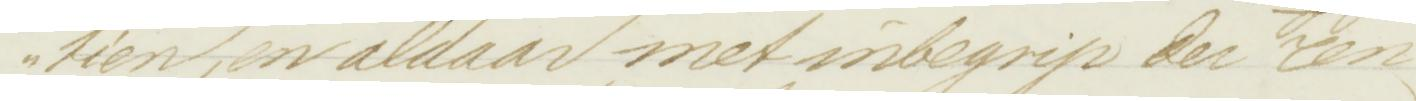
„tien, en aldaar met inbegrip der ren
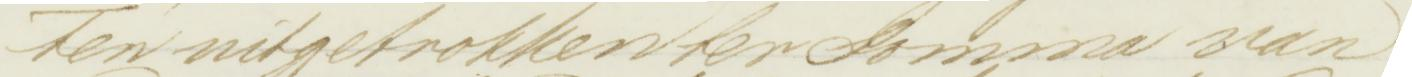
ten uitgetrokken ter somma van
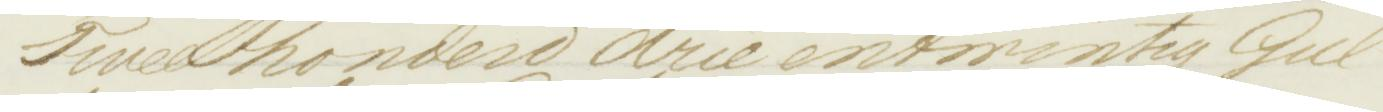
Twee honderd drie entwintig Gul
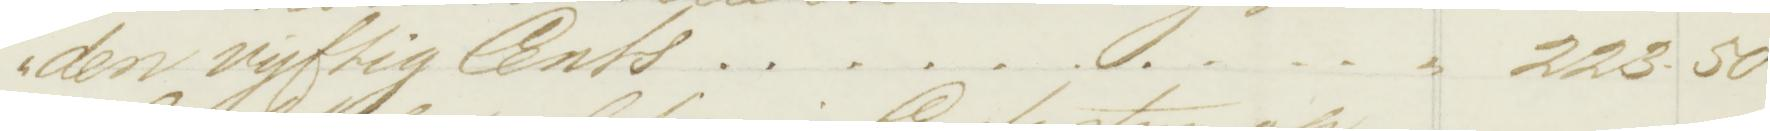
„den vijftig Cents . . . . . . . . . . „ 223.50
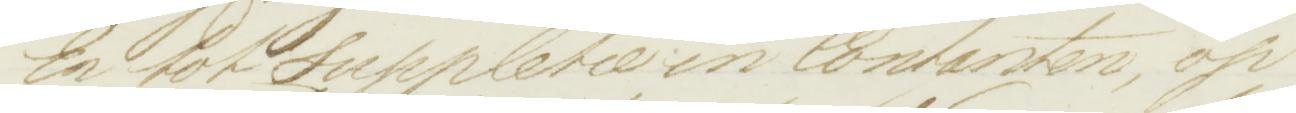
En Tot Suppletie in Contanten, op
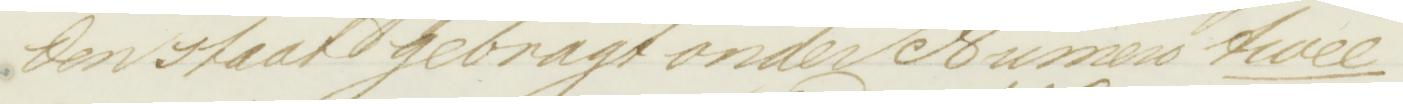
Den staat gebragt onder Numero twee
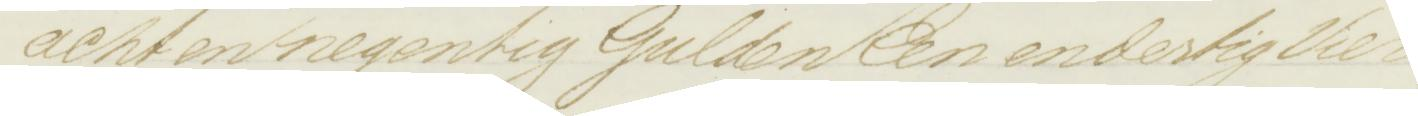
acht en negentig Gulden Een endertig Vier
